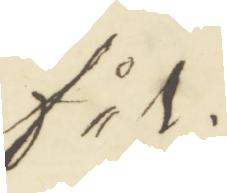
f„o 1.
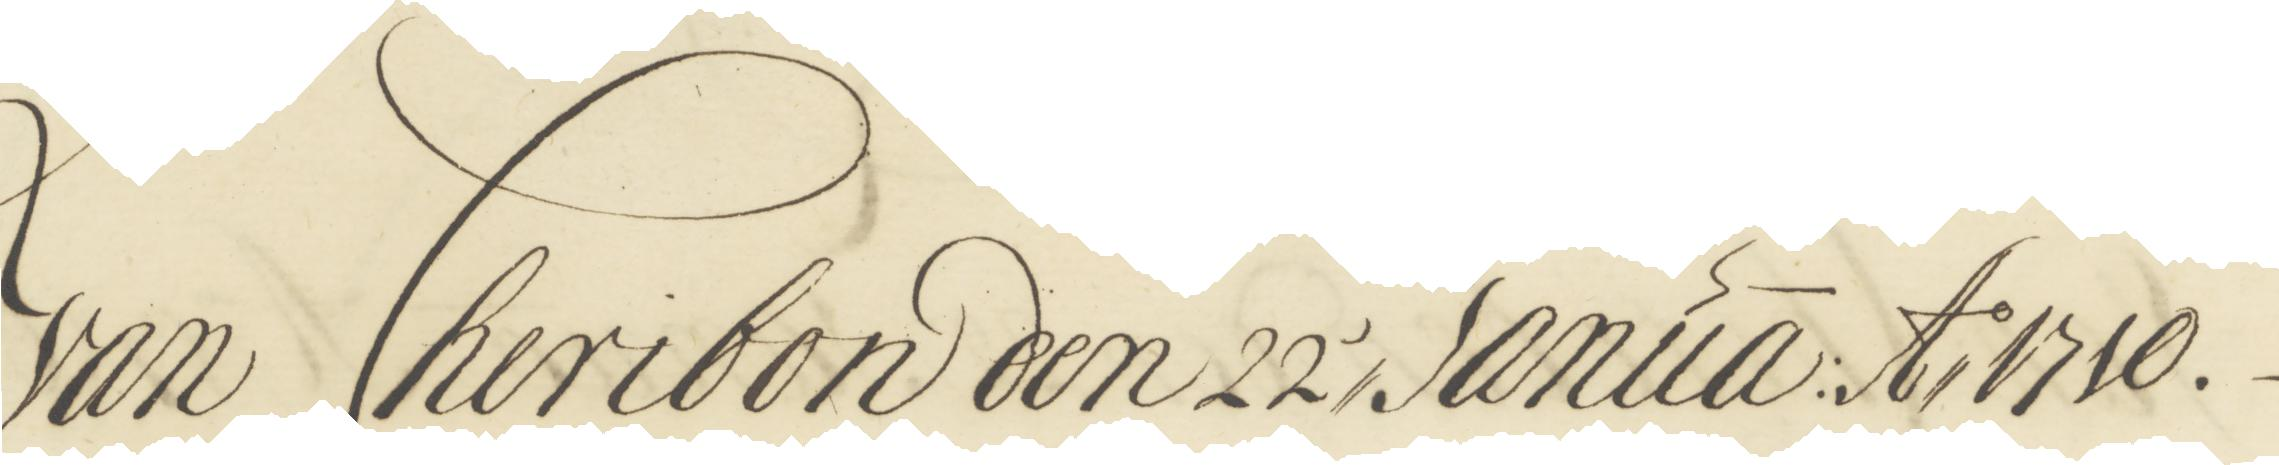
Van Cheribon den 22„e Ianua: A„o 1710.
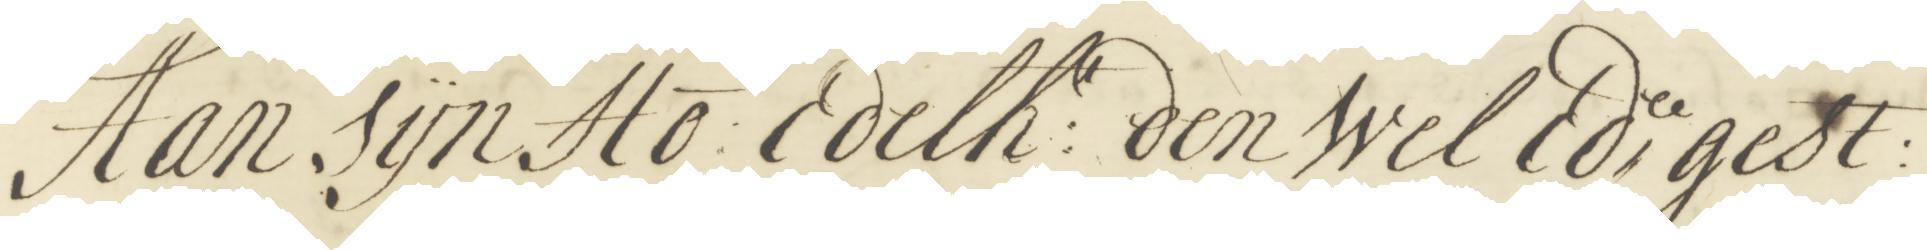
Aan sijn Ho: Edelh:t den wel Ed„le gest:
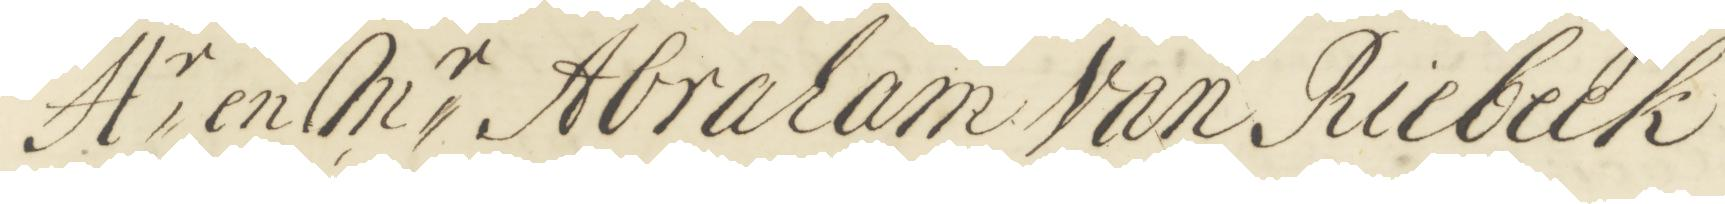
H„r en M„r Abraham van Riebeek
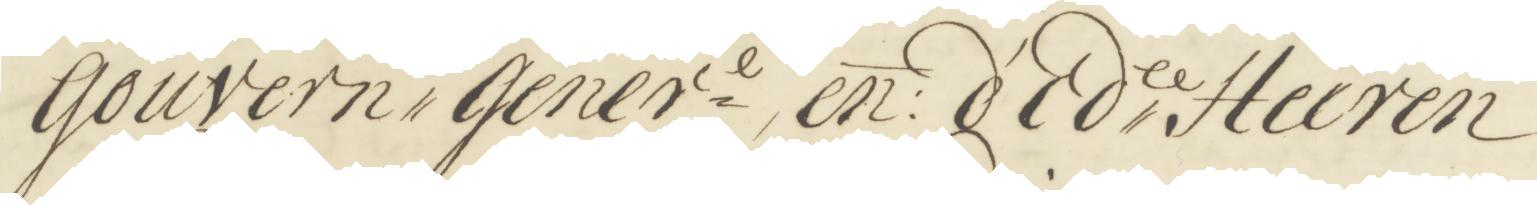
gouvern„r gener=l, en: d' Ed„le Heeren
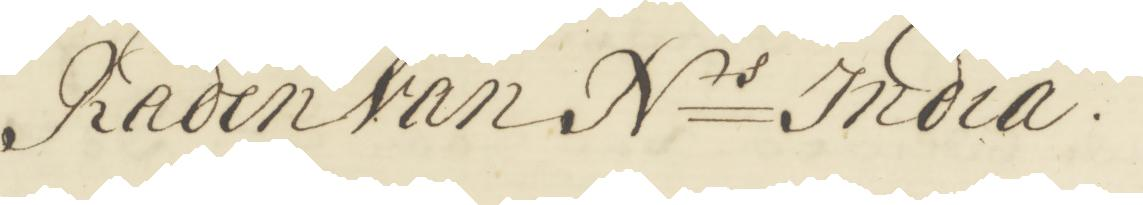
Raden van N=s India.
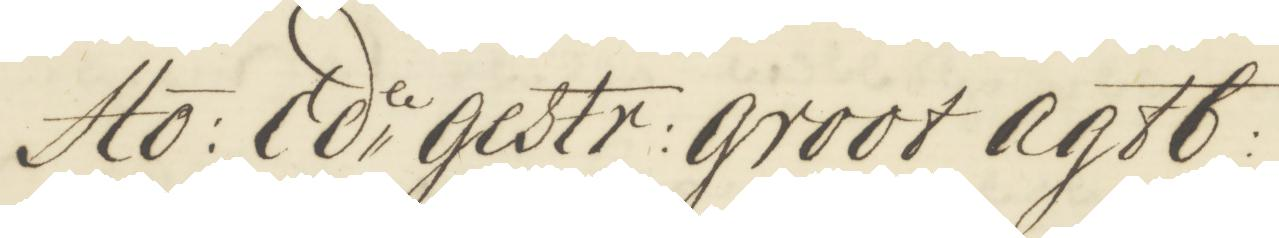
Ho: Ed„le gestr: groot agtb:
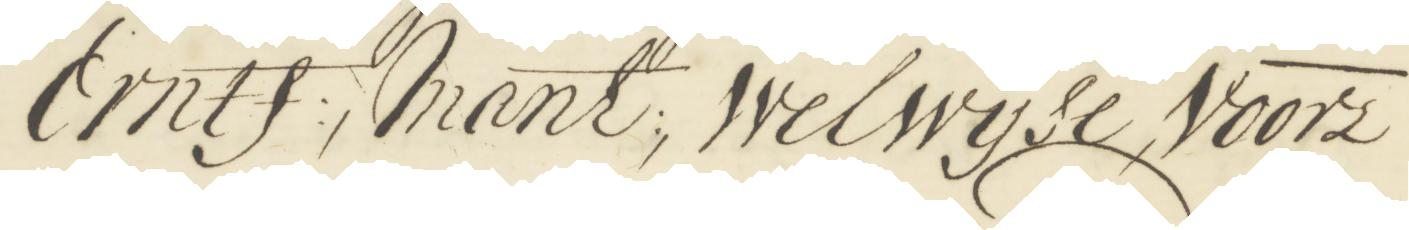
Erntf:, Manh:, welwijse, voorz
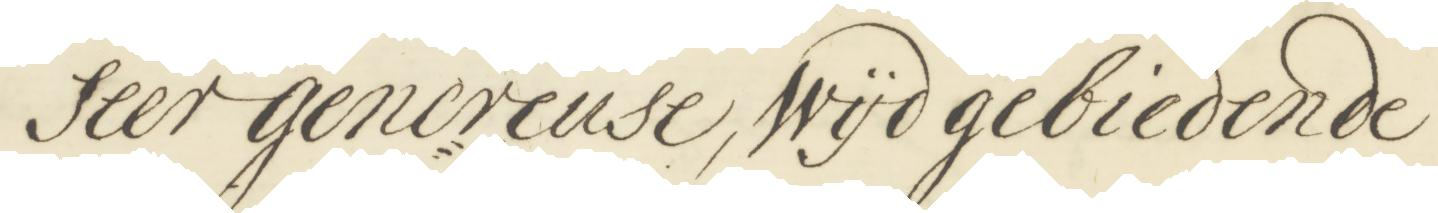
seer genereuse, wijd gebiedende
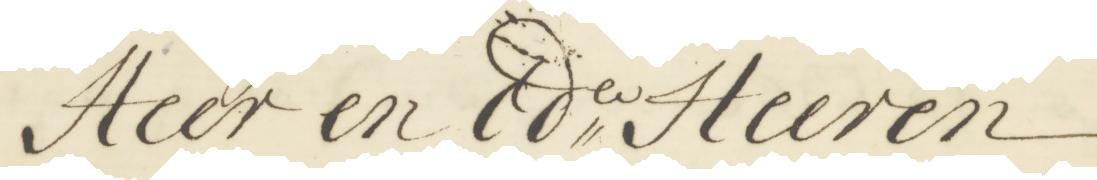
Heer en Ed„le Heeren
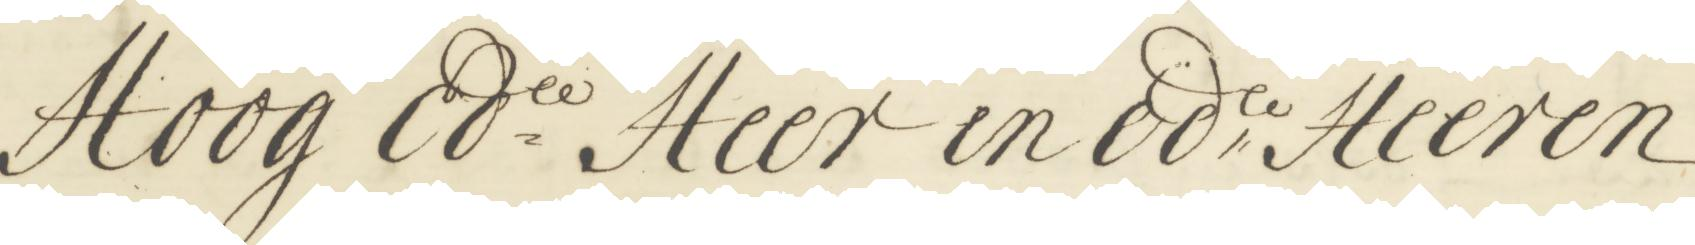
Hoog Ed=le Heer en Ed„le Heeren
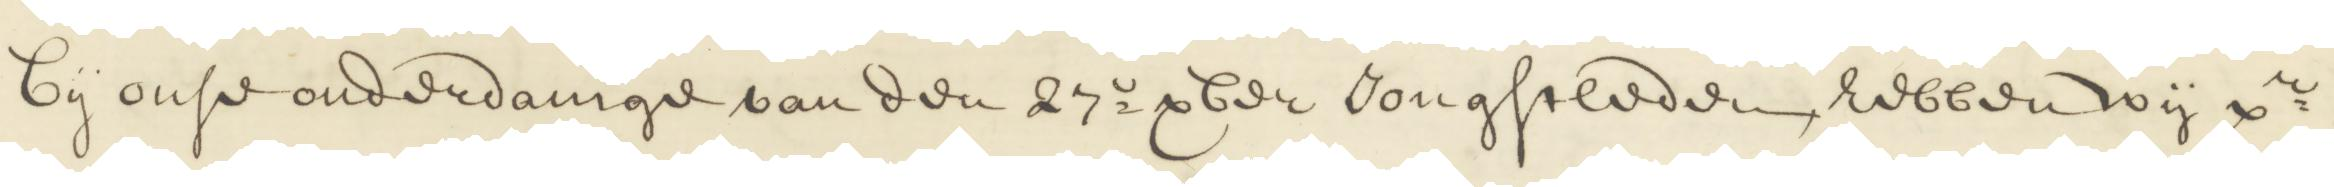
bij onse onderdanige van den 27=e xber Jongstleden, hebben wij p=r
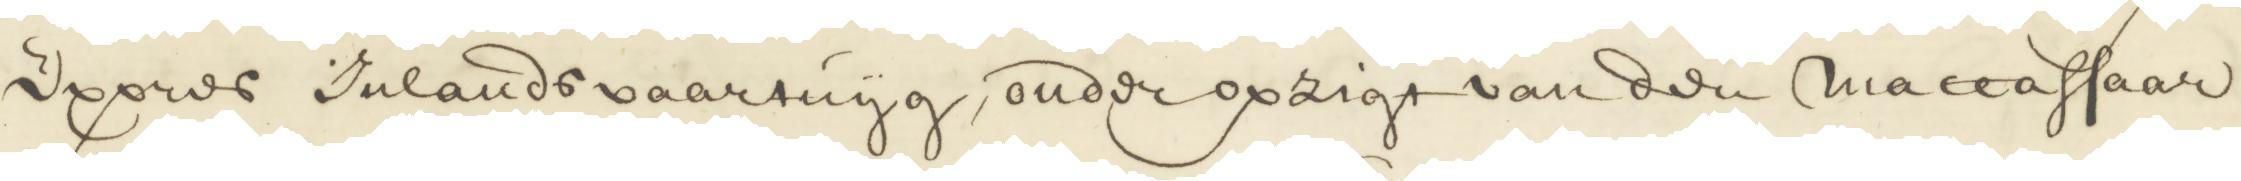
Expres Inlands vaartuijg, onder opzigt van den maccassaar
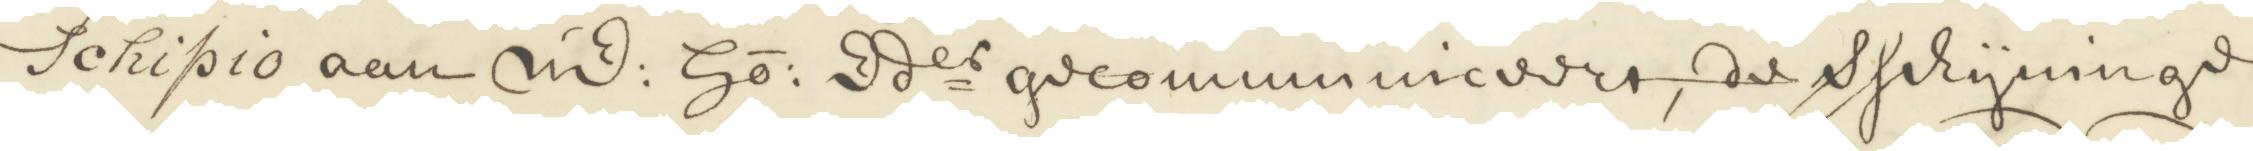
schipio aan uE: Ho: Ed=ls gecommuniceert, de verschijninge
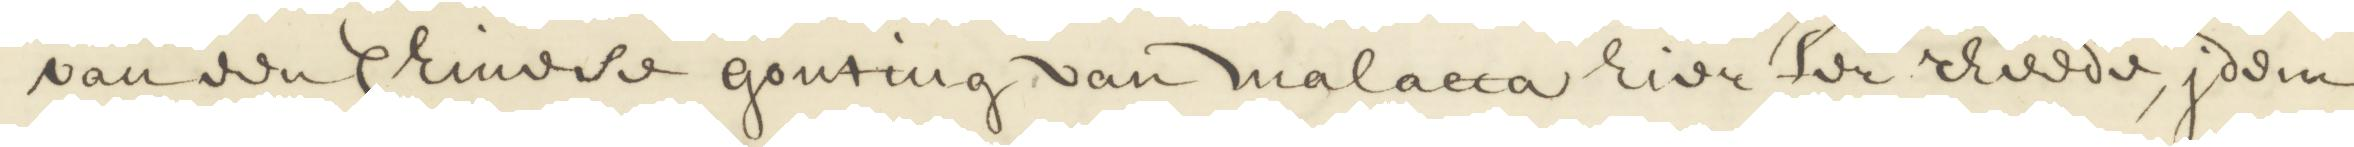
van een Chinese gonting van malacca hier ter rheede, jdem
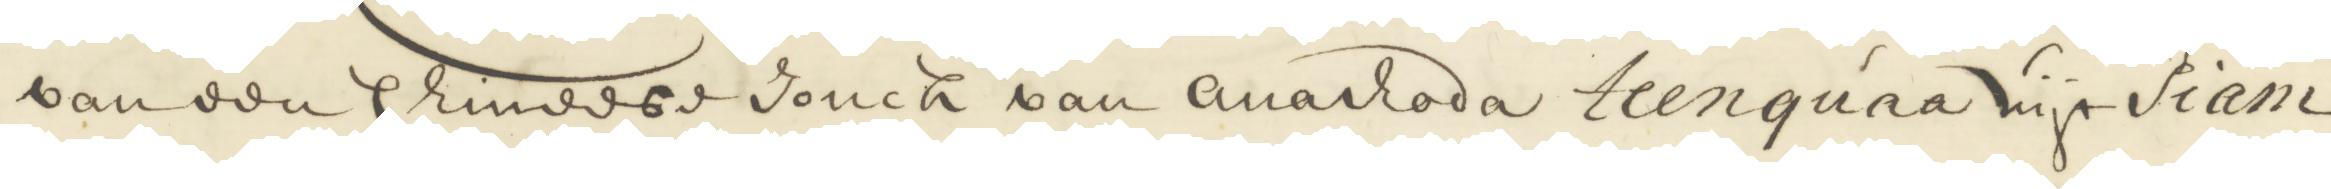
van een Chineese Ionck van anachoda teenquaa uijt siam
